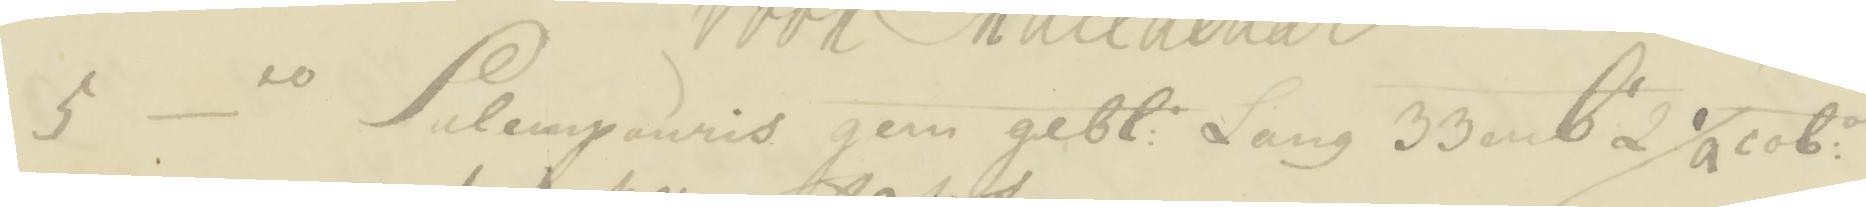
5 _o Salempouris gem gebl: Lang 33 en bt 2¼ cob:o
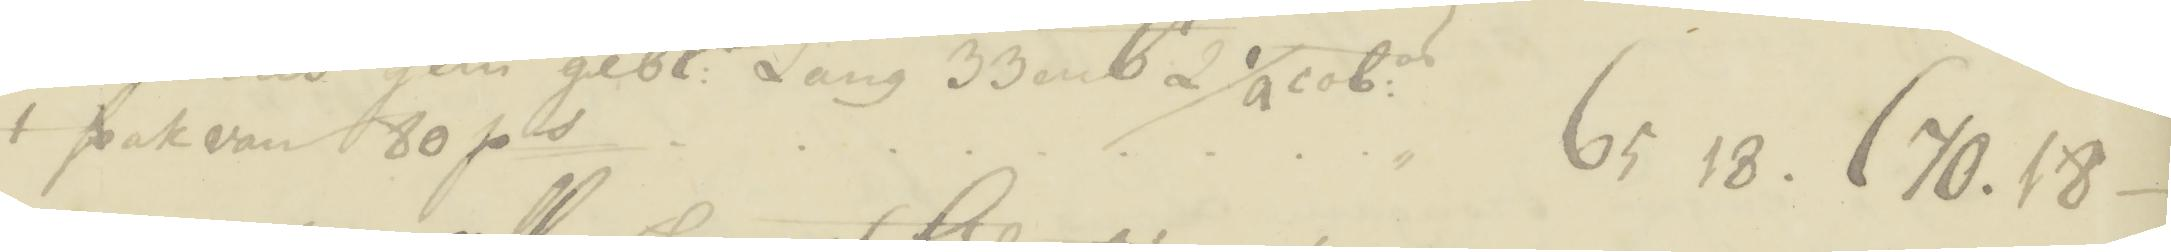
t pak van 80 p=s . . . . . . . . . „ 65 18. C70.18 —
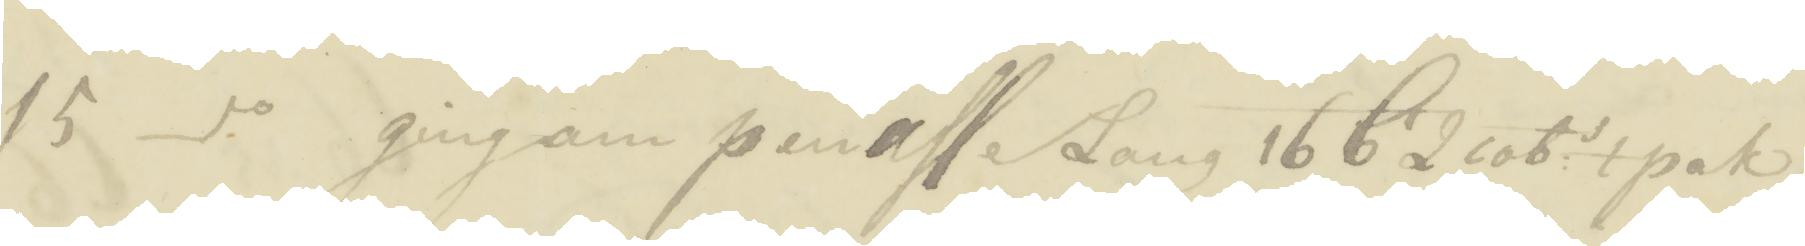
15 _o gingam penasse Lang 16 bt 2 cob:s t pak
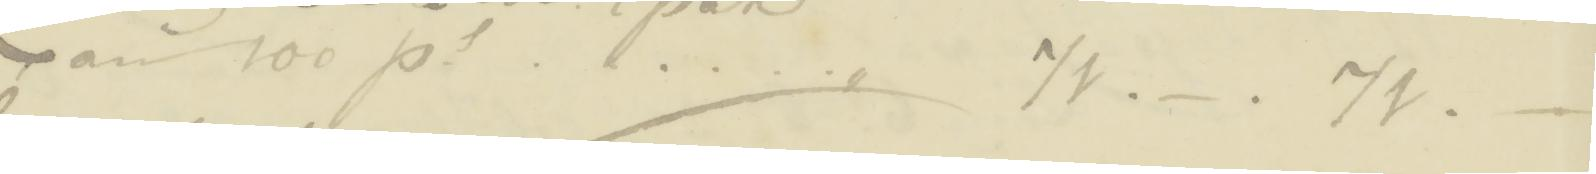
van 100 p=s . . . . . „ 71.—. 71. —
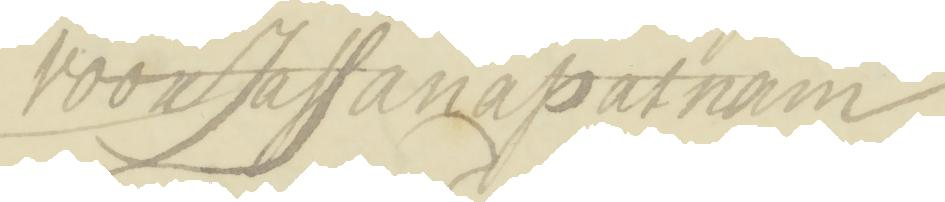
voor Jaffanapatnam;
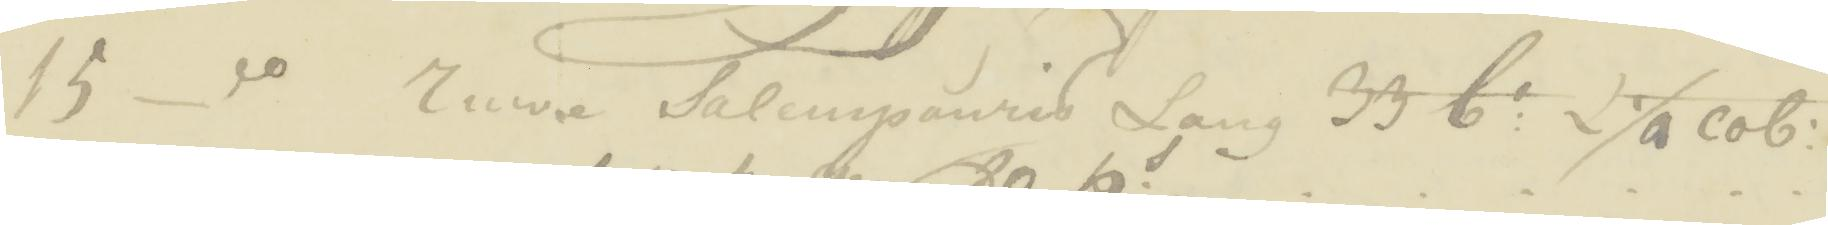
15 _o Ruwe Salempouris Lang 33 b:t 2¼ cob:
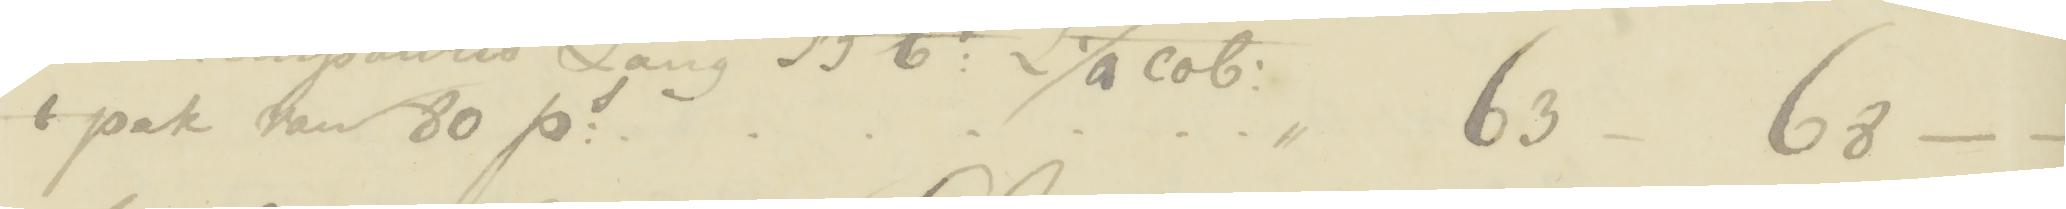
t pak van 80 p:s . . . . . . . „ 63 — 68 —
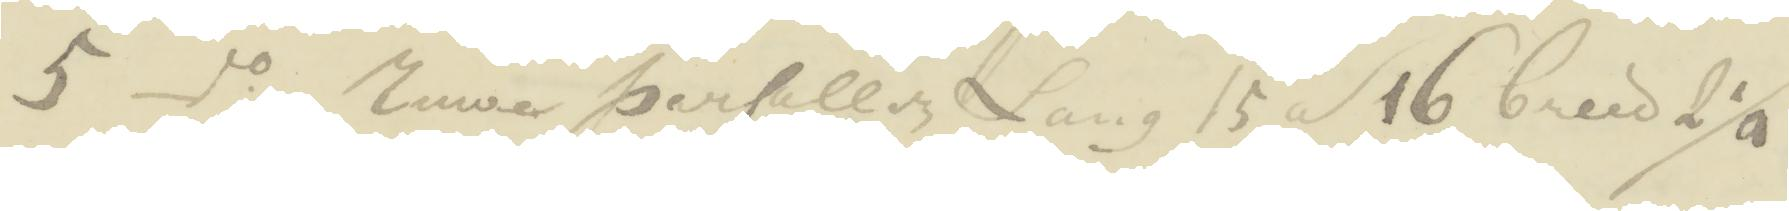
5 _o Ruwe percullen Lang 15 a 16 breed 2¼
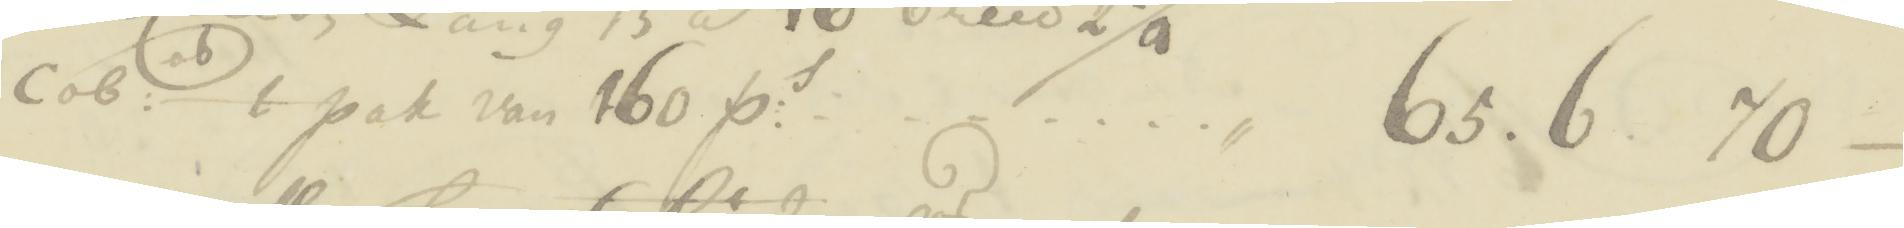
cob:os t pak van 160 p:s . . . . . . „ 65. 6 70 —
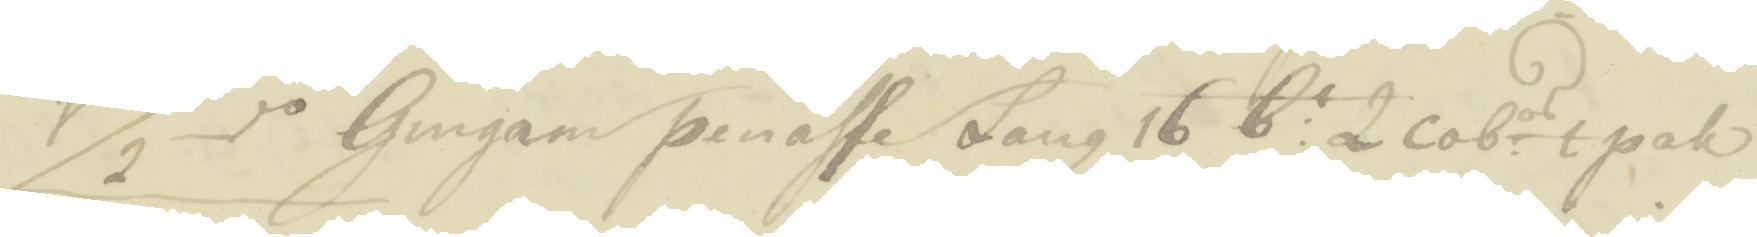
1½ _o Gingam penasse Lang 16 b:t 2 cob:os t pak
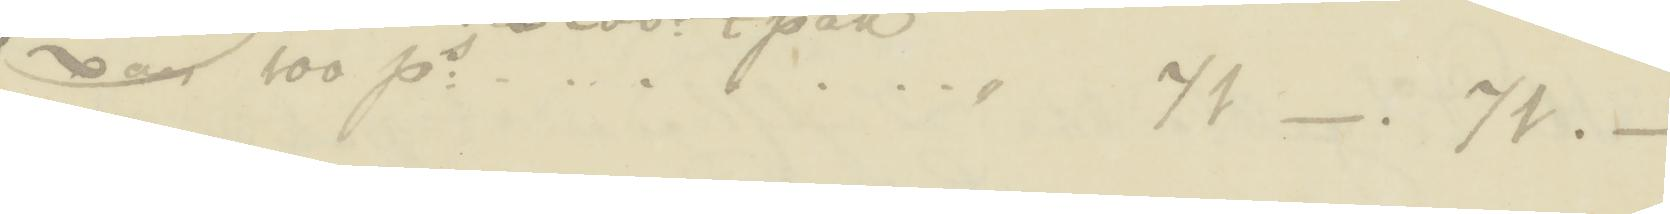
van 100 p:s . . . . . . . „ 71 —. 71.—
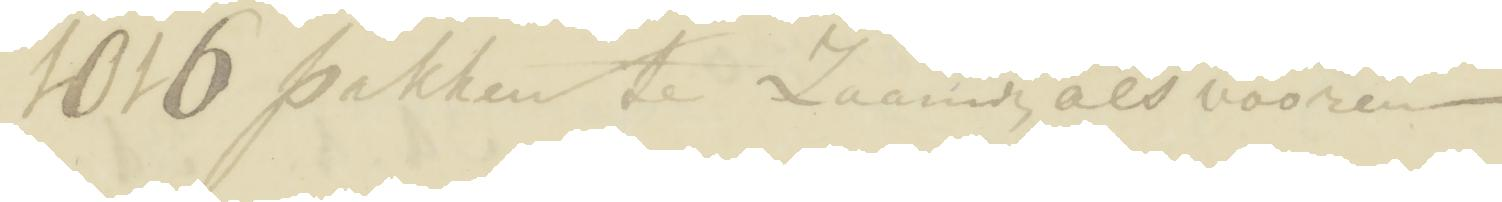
1016 pakken te zaamen als vooren
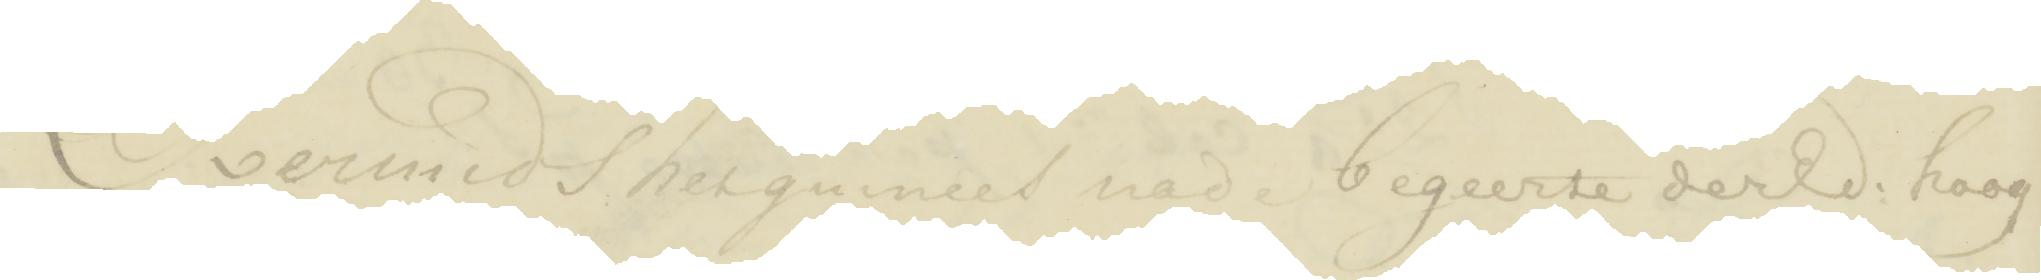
Overmids het guinees na de begeerte der Ed: hoog
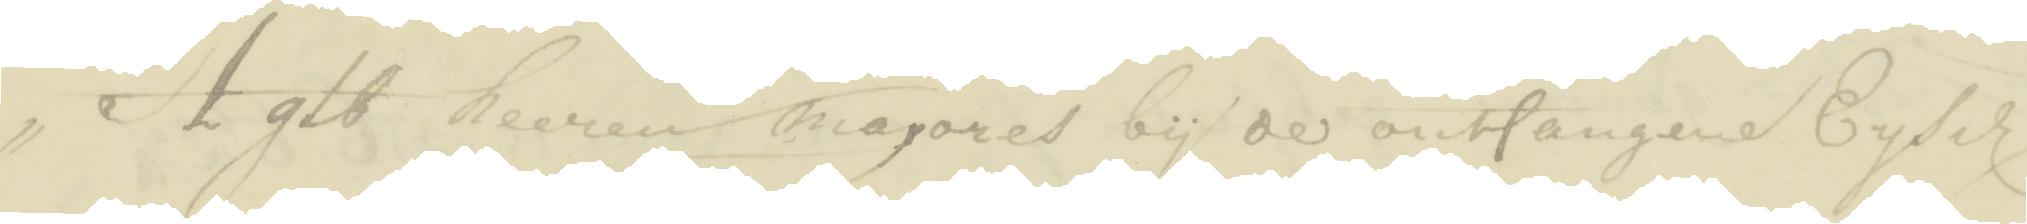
„ Agtb heeren majores bij de ontfangene Eysch
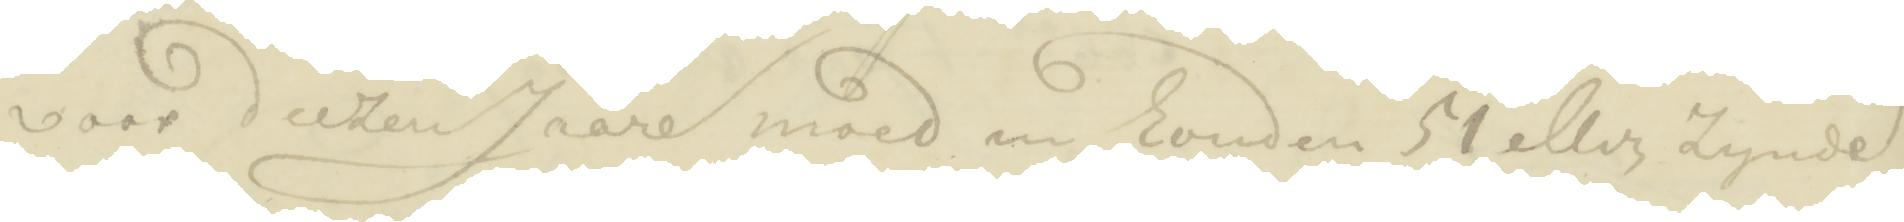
voor deezen Jaare moed in houden 51 ellen zynde
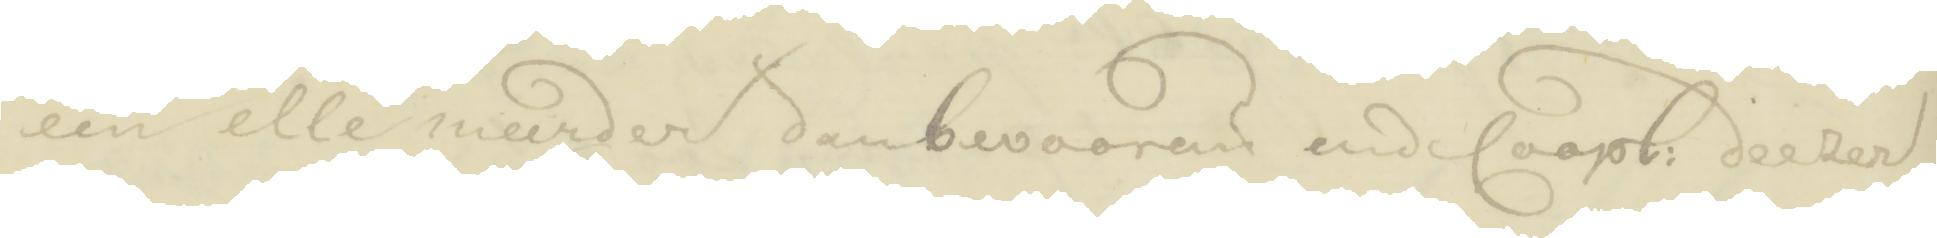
een elle meerder dan bevoorend ende Coopl: deezer
